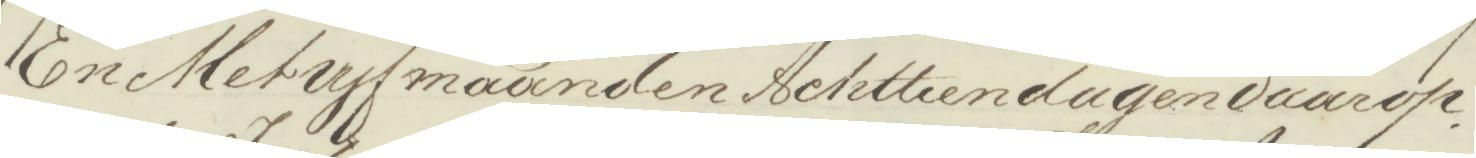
En Met vyf maanden Achttien dagen daarop
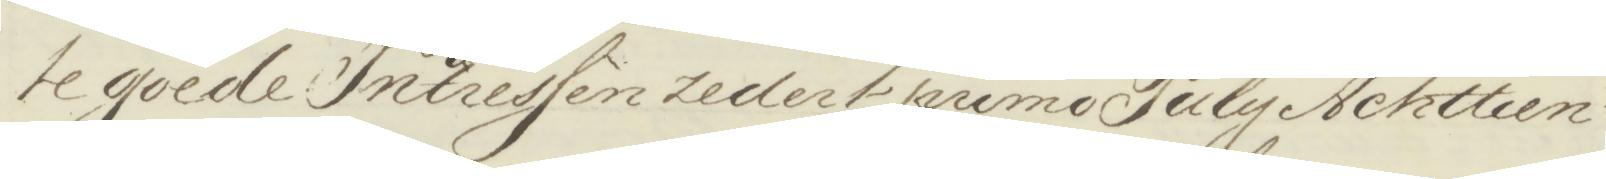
te goede Intressen zedert primo July Achttien
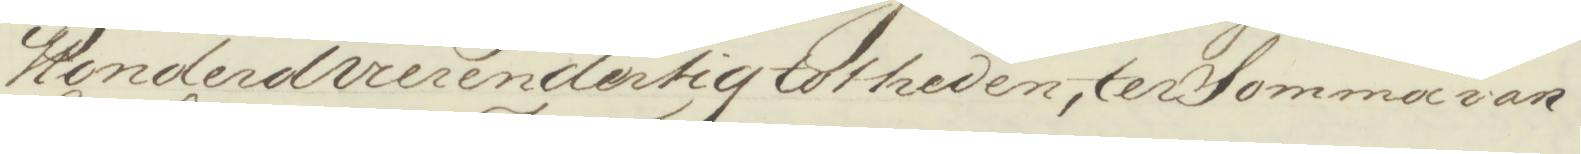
Honderd vierendertig tot heden, ter somma van
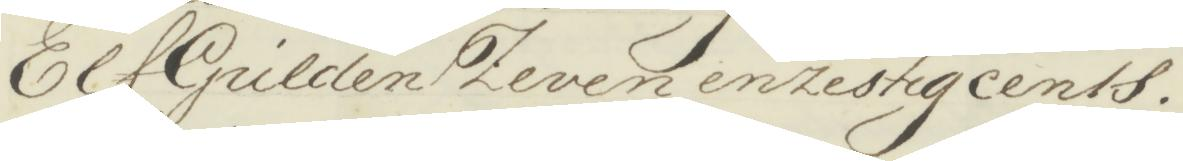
Elf Gulden Zeven en zestig cents.
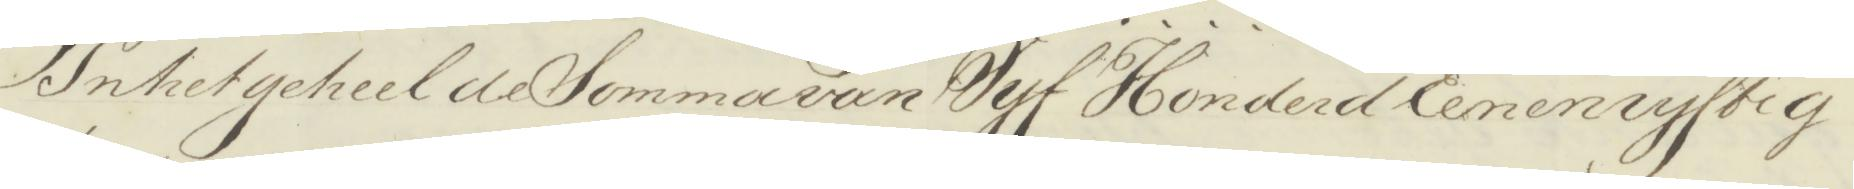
In het geheel de Somma van Vyf Honderd Eenenvyftig
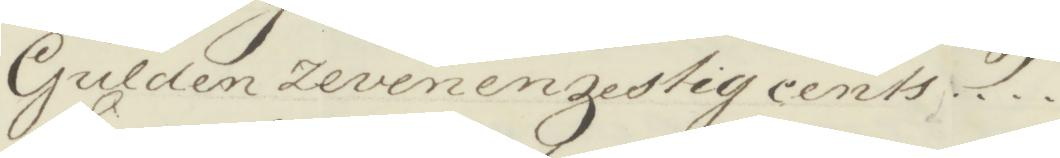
Gulden zevenenzestig cents.
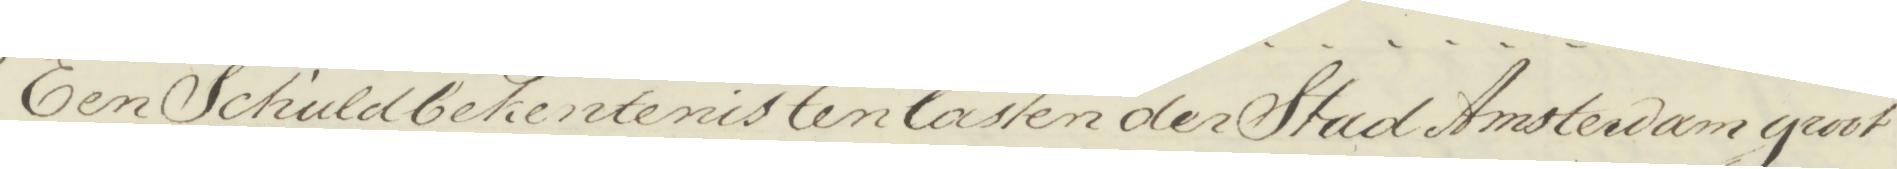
Een Schuldbekentenis ten lasten der Stad Amsterdam groot
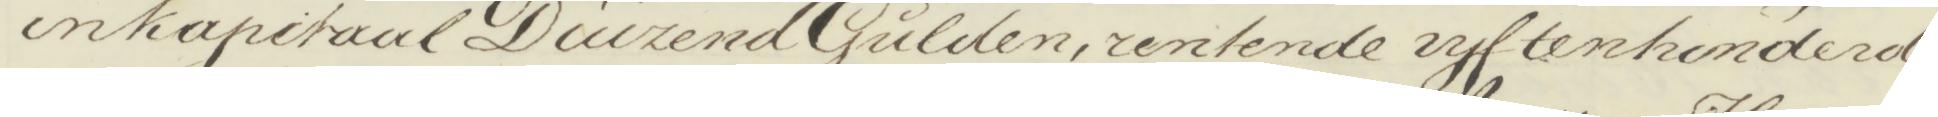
in kapitaal Duizend Gulden, rentende vyf ten honderd
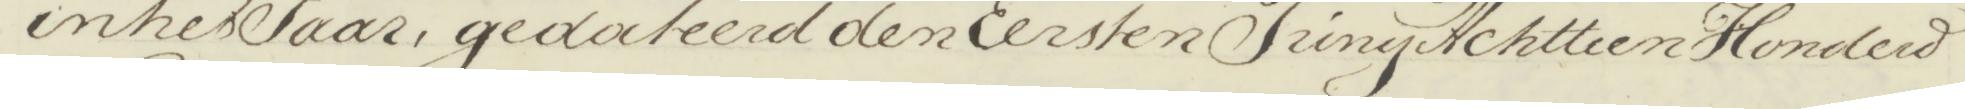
in het Jaar, gedateerd den Eersten Juny Achttien Honderd
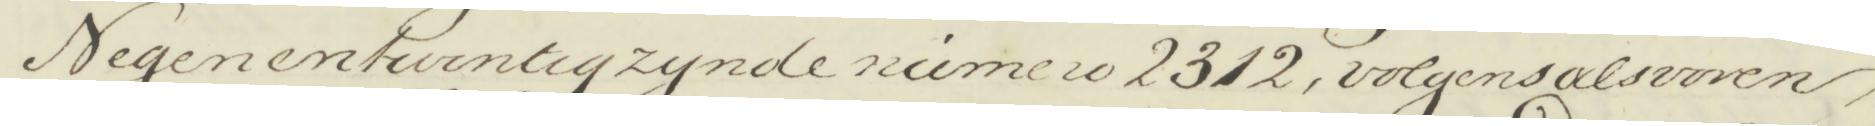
Negen en twintig zijnde numero 2312, volgens als voren,
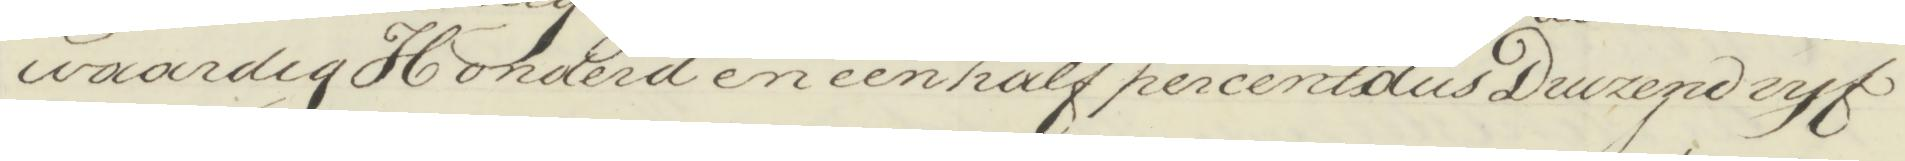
waardig Honderd en een half percent dus Duizend vyf
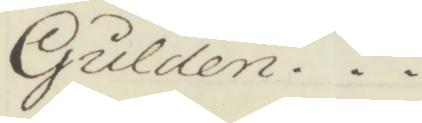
Gulden. . .
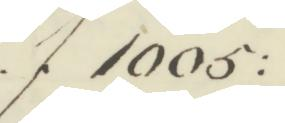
ƒ 1005:
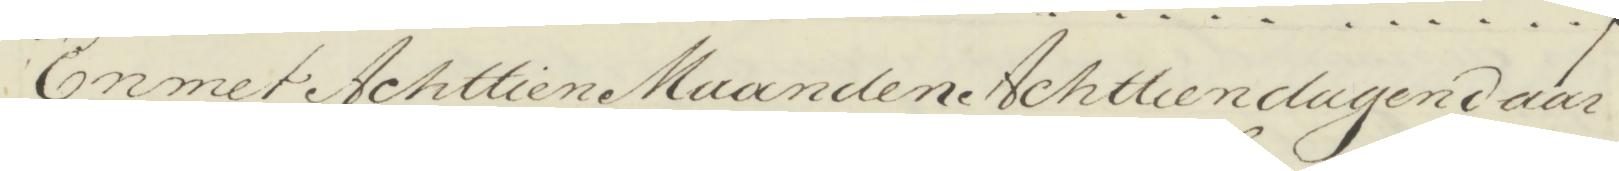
En met Achttien Maanden Achttien dagen daar
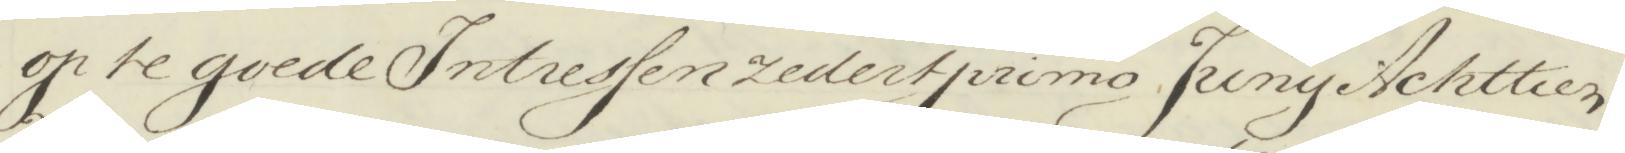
op te goede Intressen zedert primo Juny Achttien
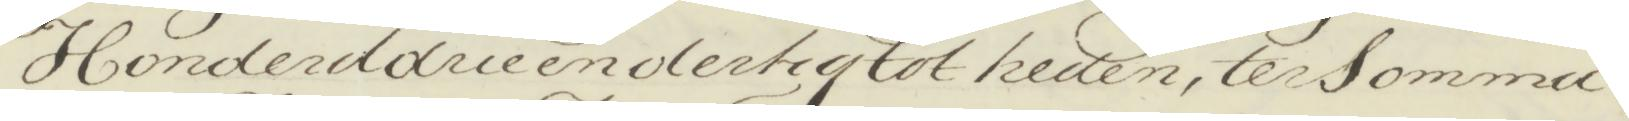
Honderd drie en dertig tot heden, ter somma
